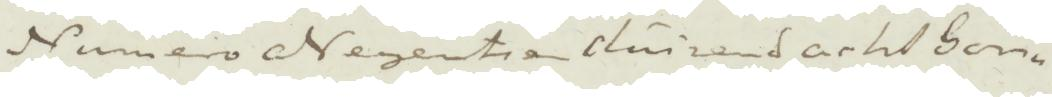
Numero Negentien duizend acht hon
